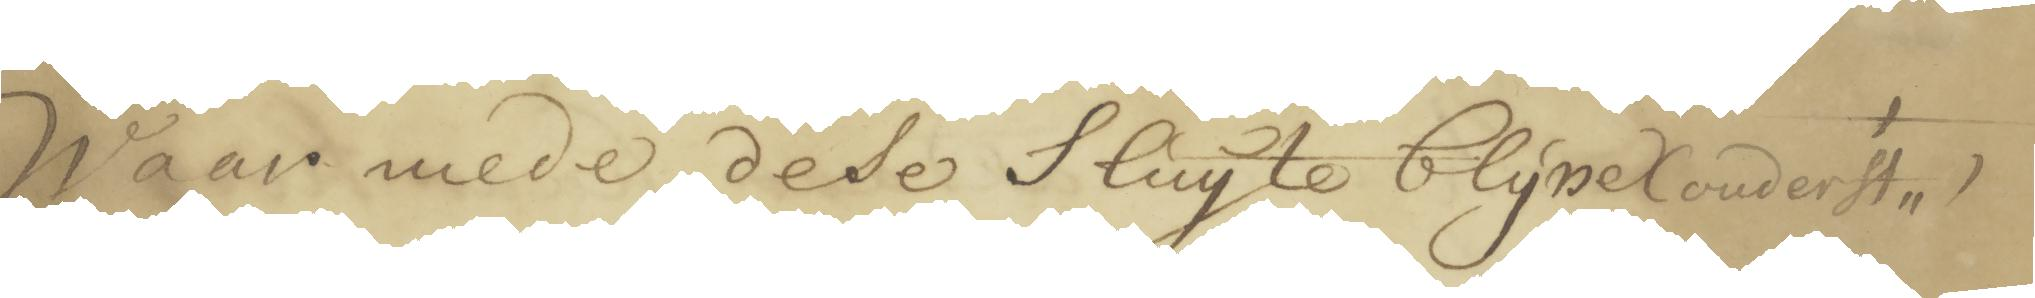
Waar mede dese sluijte blijve (onderst„t)
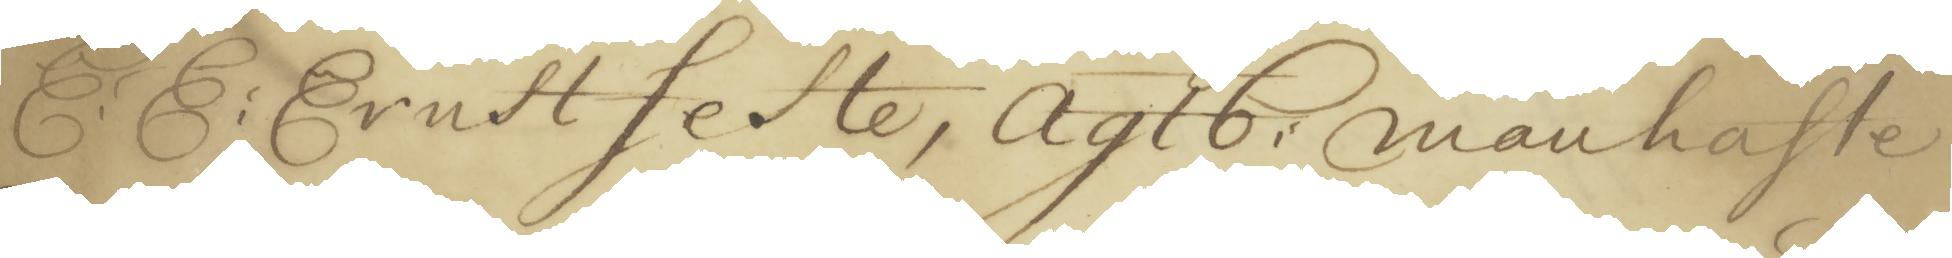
E:E: Ernstfeste, Agtb: manhafte
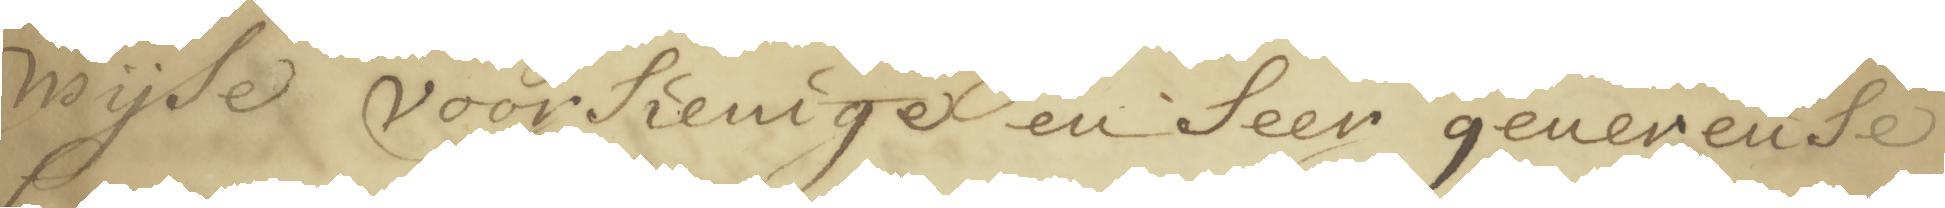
wijse voorsienige en seer genereuse
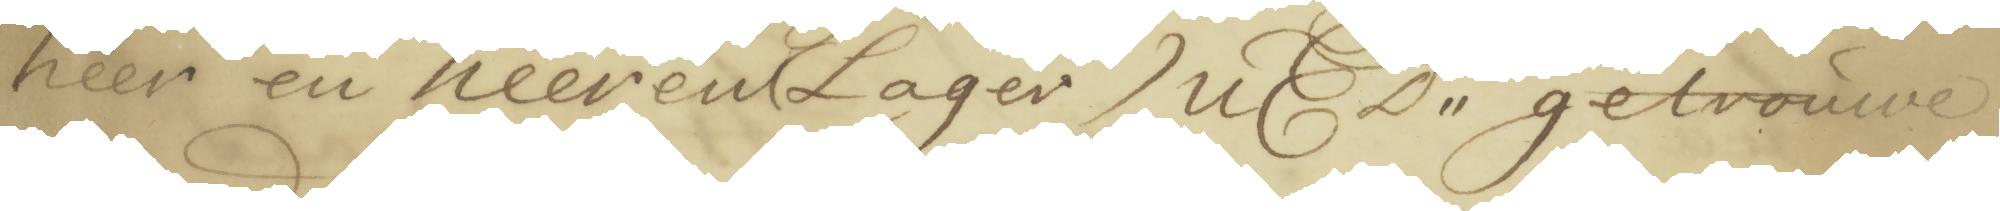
heer en heeren (lager) uED„e getrouwe
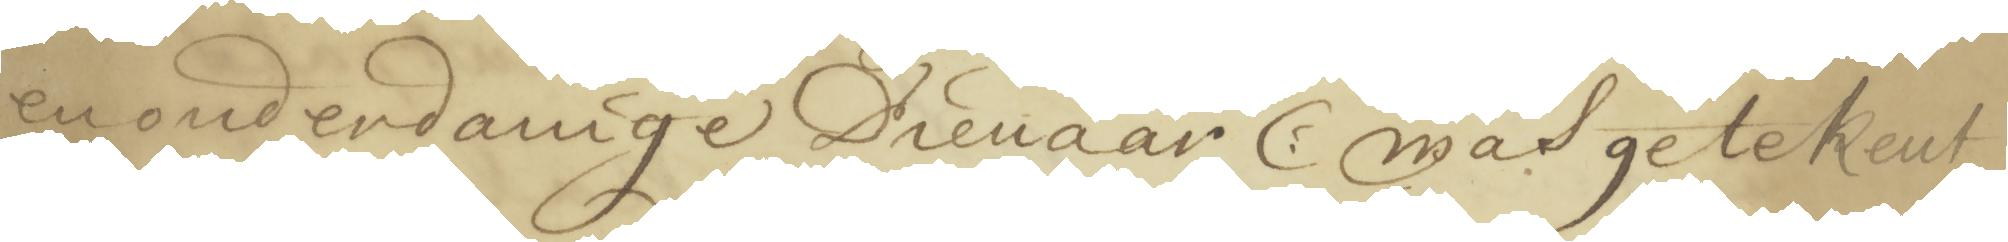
en onderdanige Dienaar (:was getekent
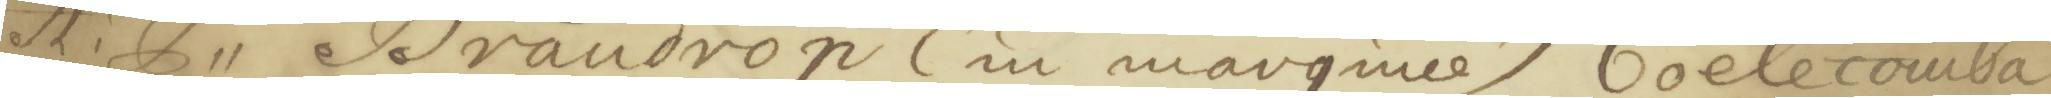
A: P„r Brandrop (in margine) boelecomba
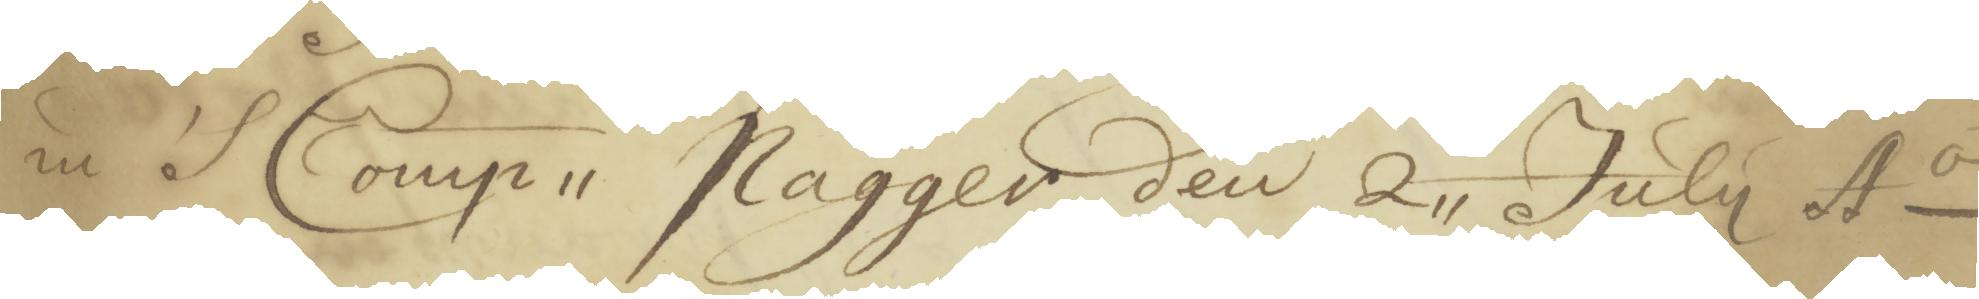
in ’s Comp„ pagger den 2„ Iulij A–o
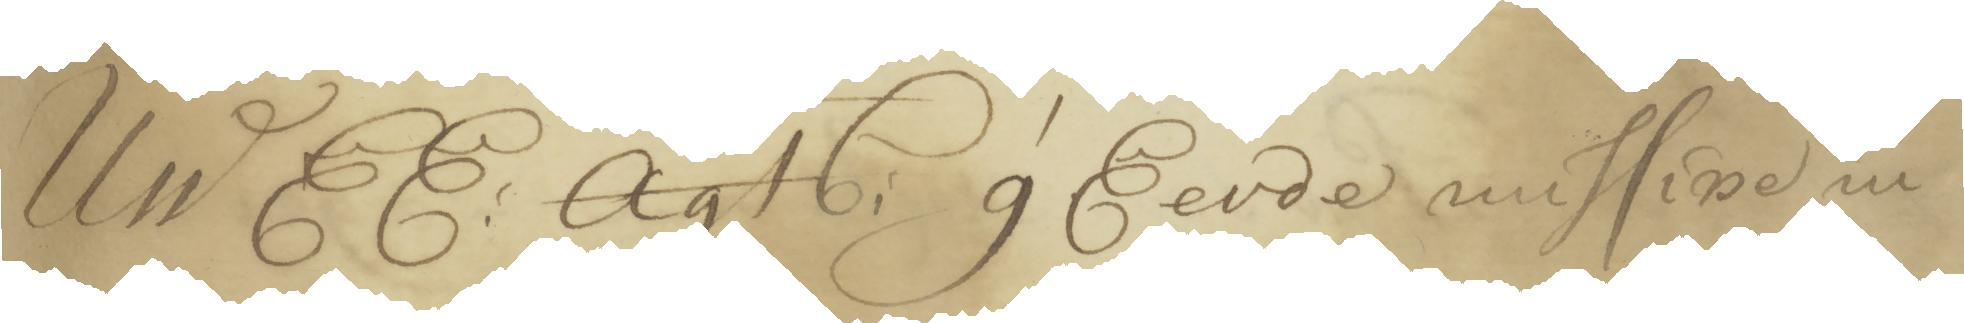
Uw EE: Agtb: g’Eerde missive in
